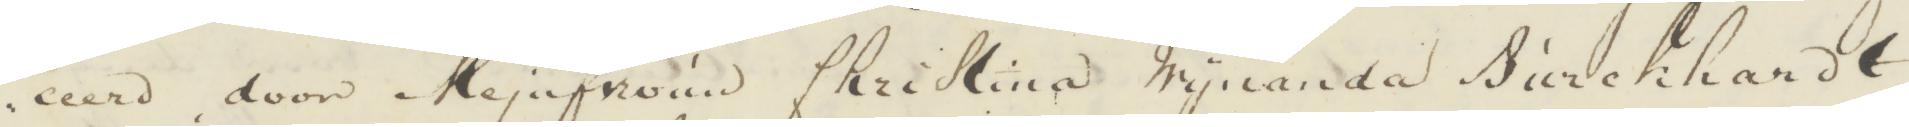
„ceerd door Mejufrouw Christina Wijnanda Burckhardt
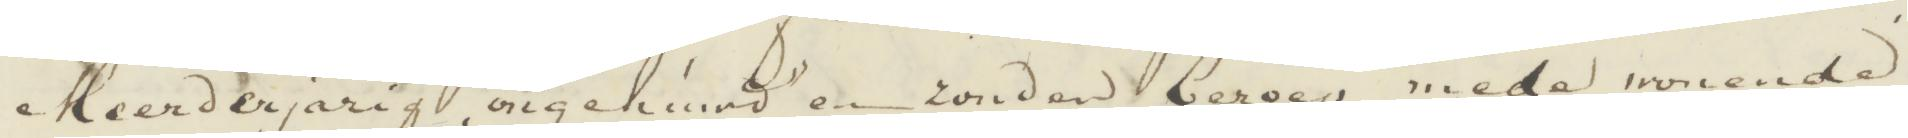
Meerderjarig, ongehuwd, en zonder beroep mede wonende
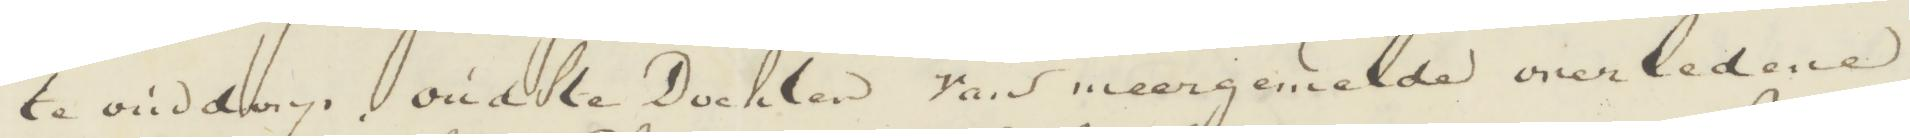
te ouddorp, oudste Dochter van meergemelde overledene
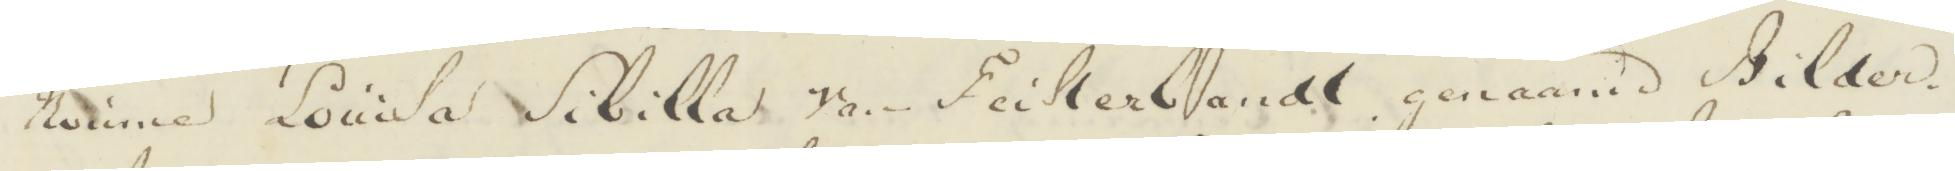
Vrouwe Louisa Sibilla van Feisterbandt, genaamd Bilder.
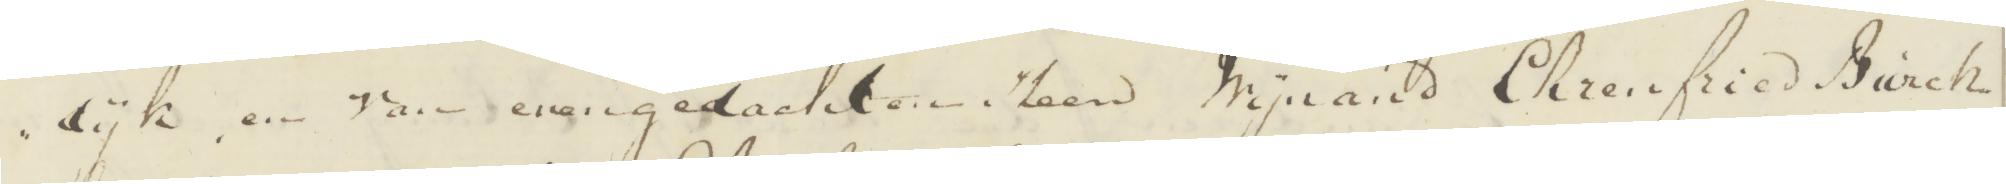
„dijk, en van evengedachten Heer Wijnand Ehrenfried Burch
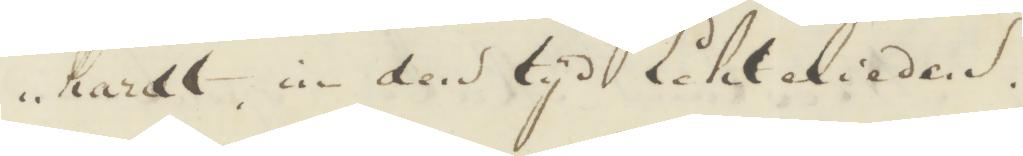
„hardt, in den tijd Echtelieden.
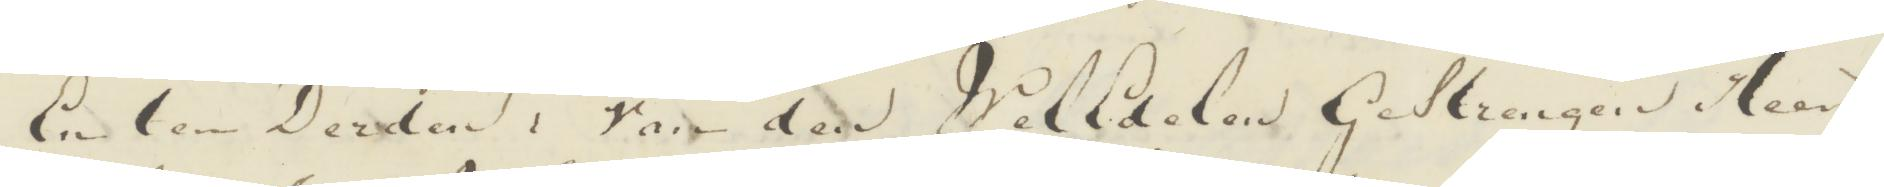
En ten Derden: van de Wel Edelen Gestrengen Heer
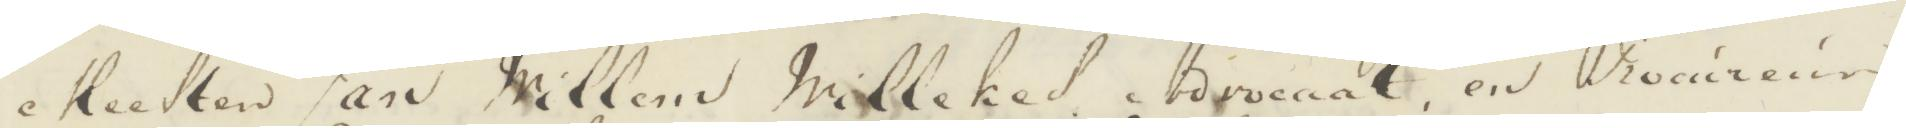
en Meester Jan Willem Willekes, Advocaat en Procureur
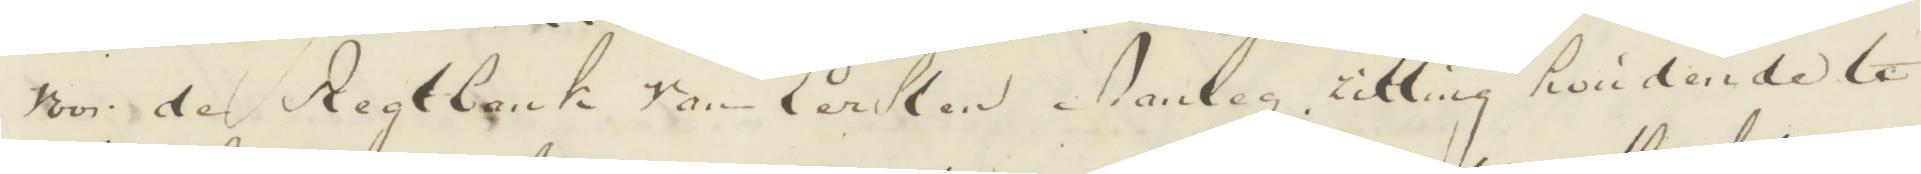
voor de Regtberk van Eersten Aanleg, zitting houdende te
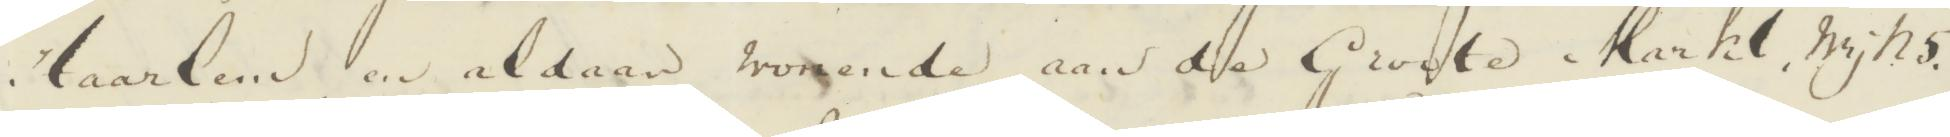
Haarlem, en aldaar wonende aan de Groote Markt, wijk 5.
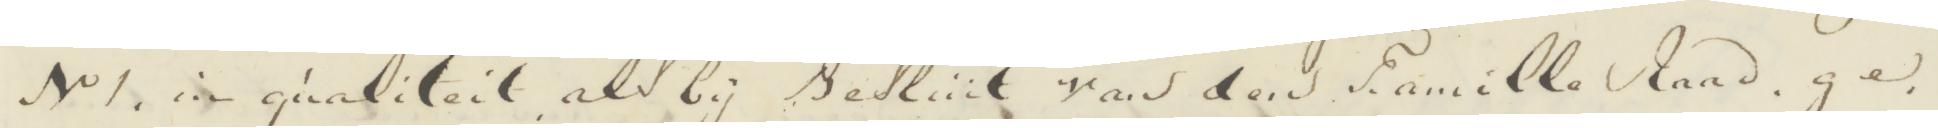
No 1. in qualiteit, als bij Besluit van den Famille Raad, ge„
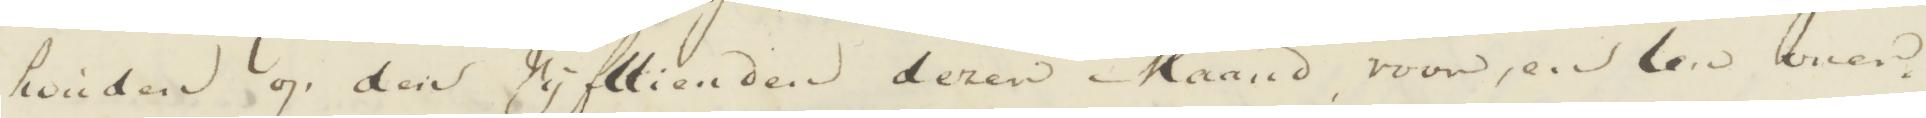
houden op den Vijftienden dezer Maand, voor, en ten over„
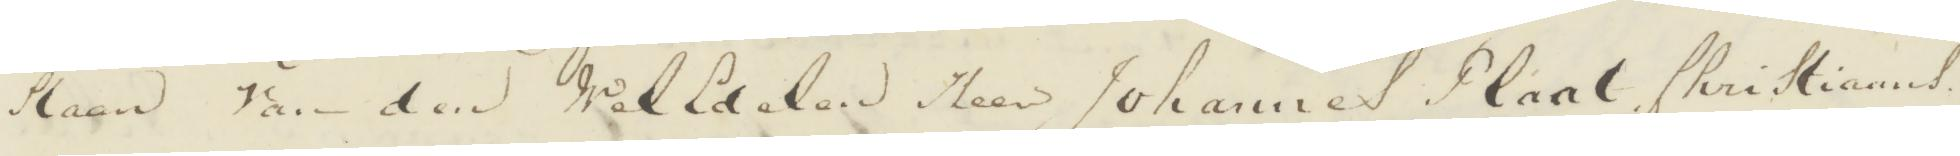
staan van den Wel Edelen Heer Johannes Plaat Christiaans.
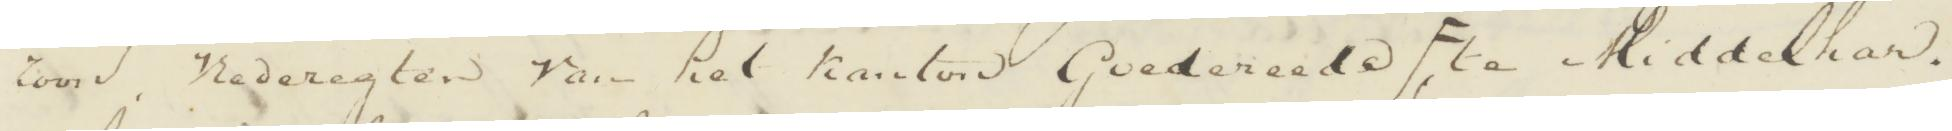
zoons, Vrederegter van het kanton Goedereede ¶te Middelhar„
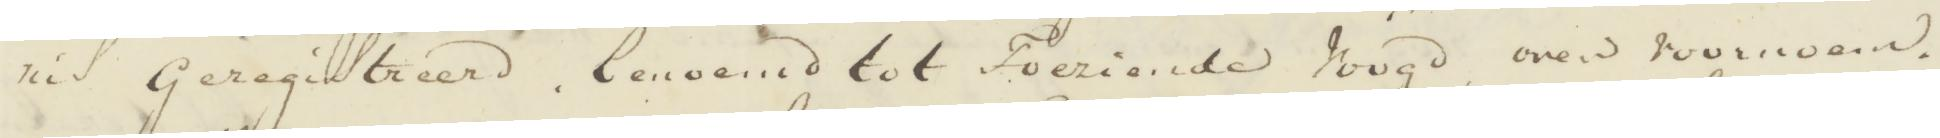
nis Geregistreerd, benoemd tot Toeziende Voogd over voornoem,
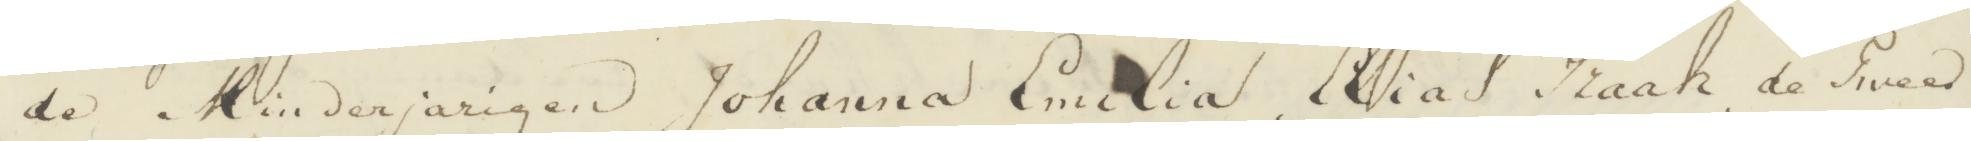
de Minderjarigen Johanna Emilia, Elias Izaak, de Twee
